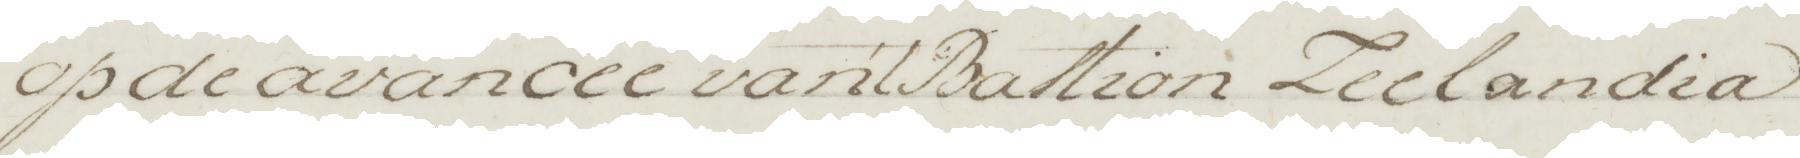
op de avancee van't Bastion Zeelandia
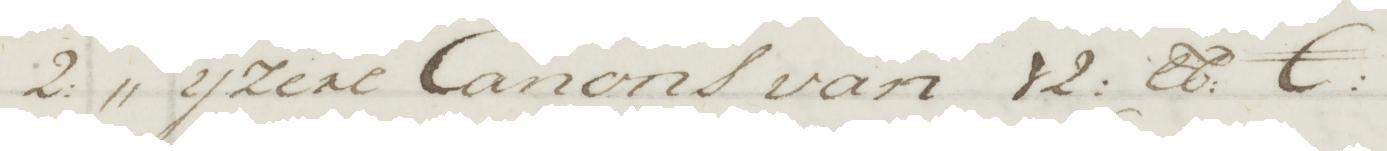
2: „ ijzere Canons van 12: lb: C:
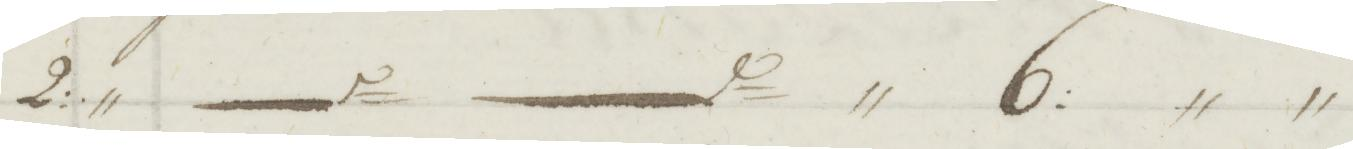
2.„ _=o _=o „ 6: „ „
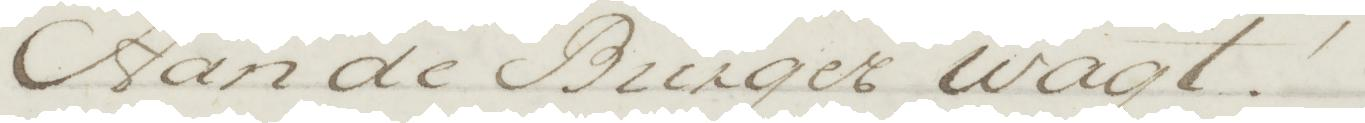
Aan de Burger wagt!
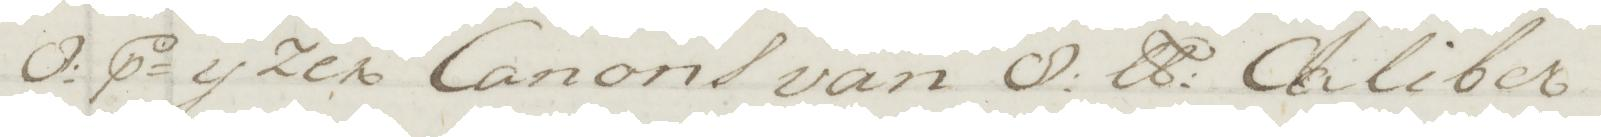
8: p=s ijzer Canons van 8: lb: Caliber
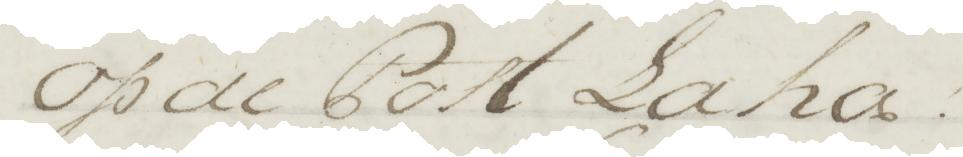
Op de Post Laha.
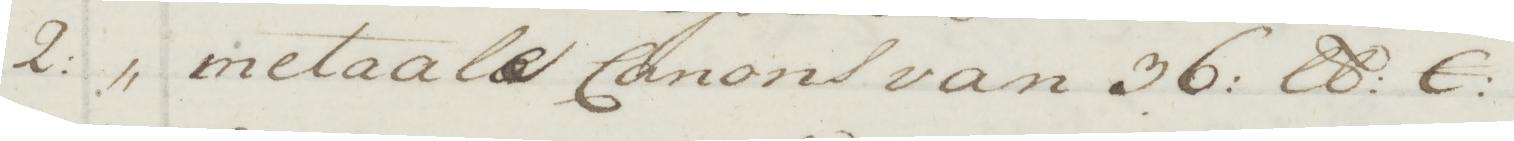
2: „ metaale Canons van 36: lb: C:
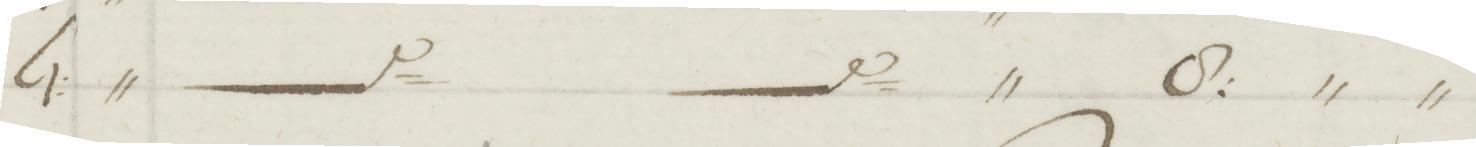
4: „ _=o _=o „ 8: „ „
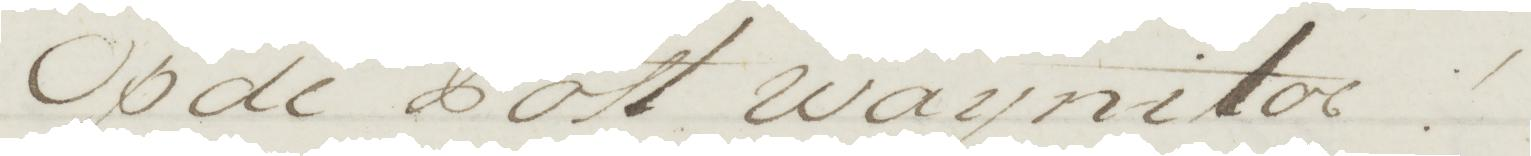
Op de Post wajnitoe!
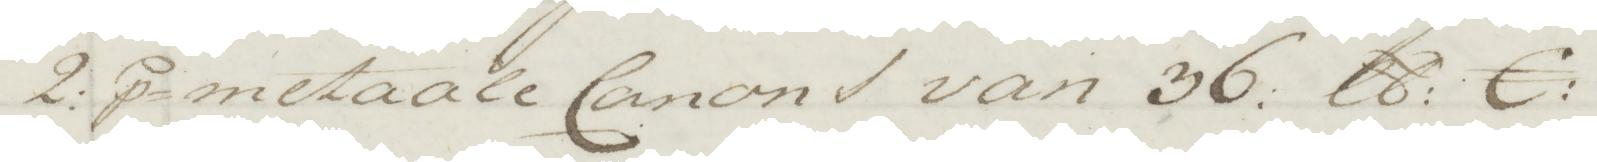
2: p=s metaale Canons van 36: lb: E:
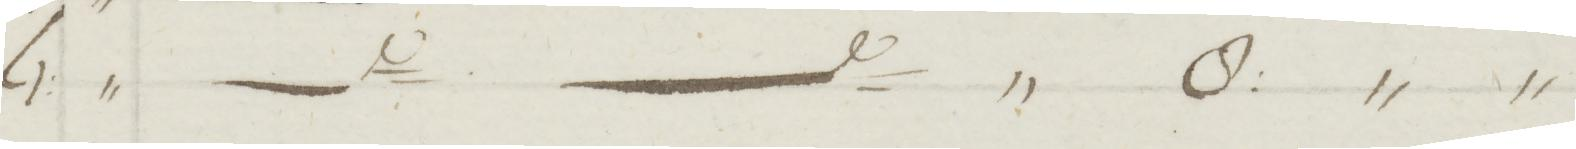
4: „ _=o _=o = „ 8: „ „
